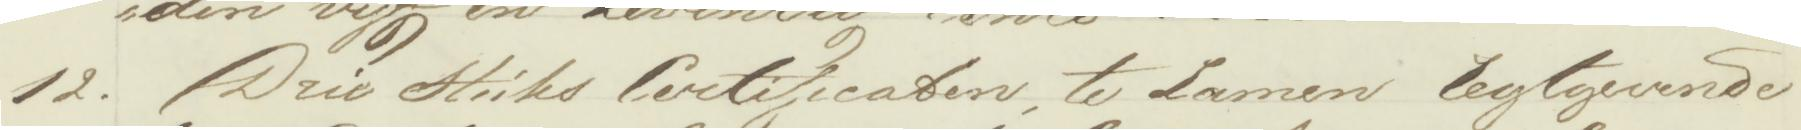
12. Drie stuks Certificaten, te zamen regtgevende
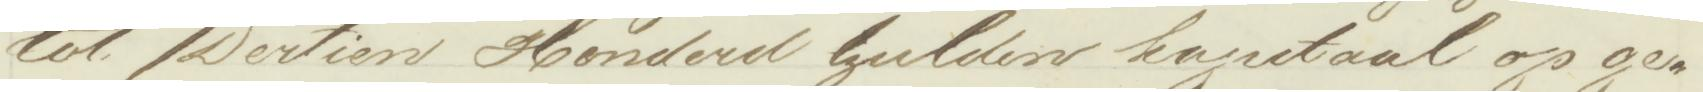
tot Dertien Honderd Gulden kapitaal op ge„
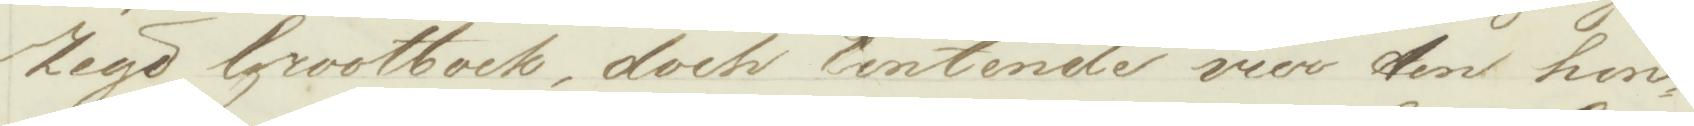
zegd Grootboek, doch rentende vier ten hon„
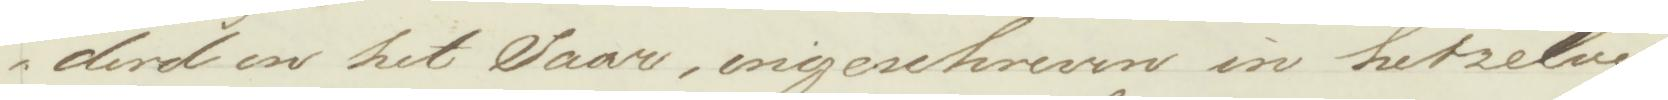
„derd in het Iaar, ingeschreven in hetzelve
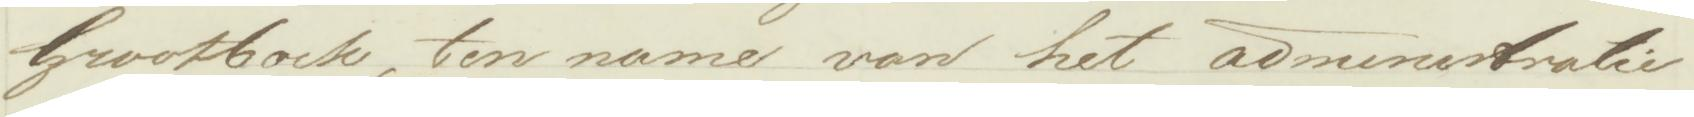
Grootboek, ten name van het administratie
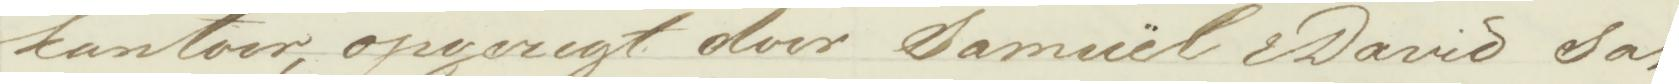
kantoor, opgerigt door Samuël & David Sa,
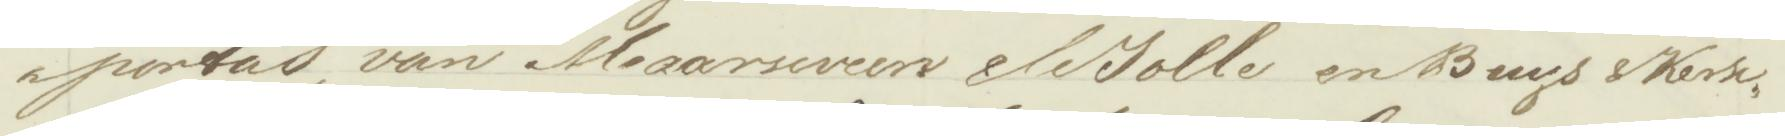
„portas, van Maarseveen & le Jolle en Buys & Kerk„
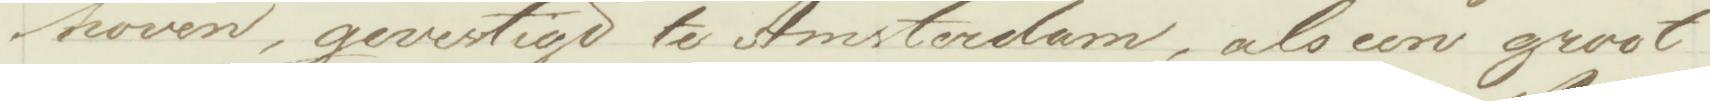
hoven, gevestigd te Amsterdam, als een groot
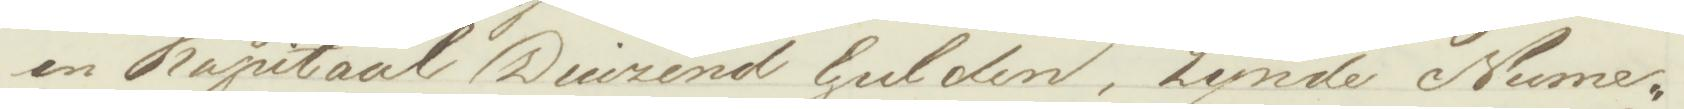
in kapitaal Duizend Gulden, zynde Nume„
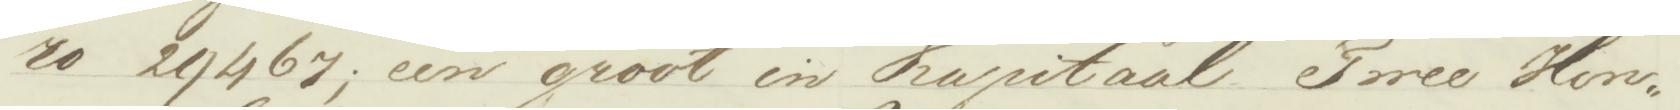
ro 29467; een groot in Kapitaal Twee Hon„
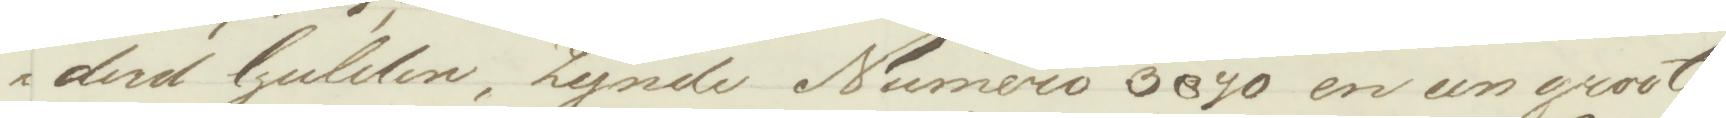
„derd Gulden, zynde Numero 3870 en een groot
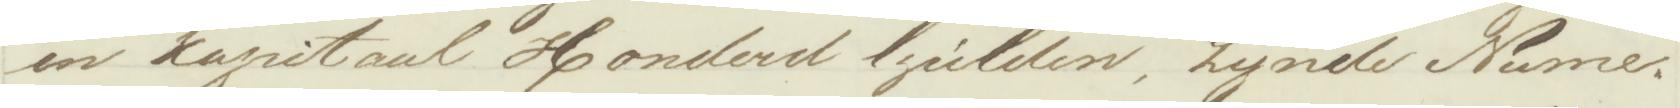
in kapitaal Honderd Gulden, zynde Nume„
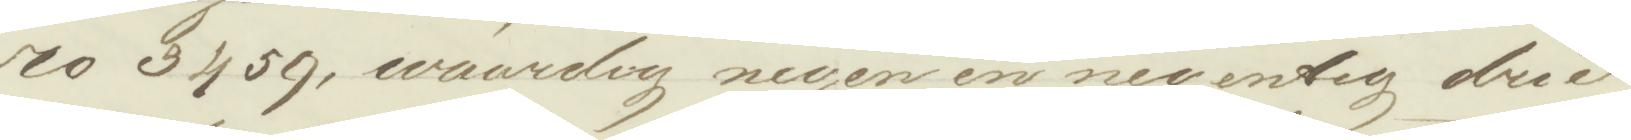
ro 3459, waardig negen en negentig drie
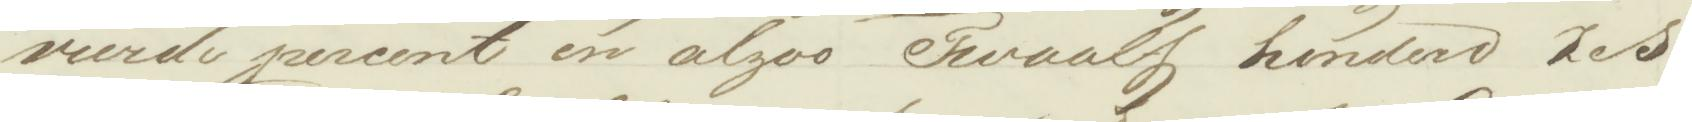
vierde percent en alzoo Twaalf honderd zes
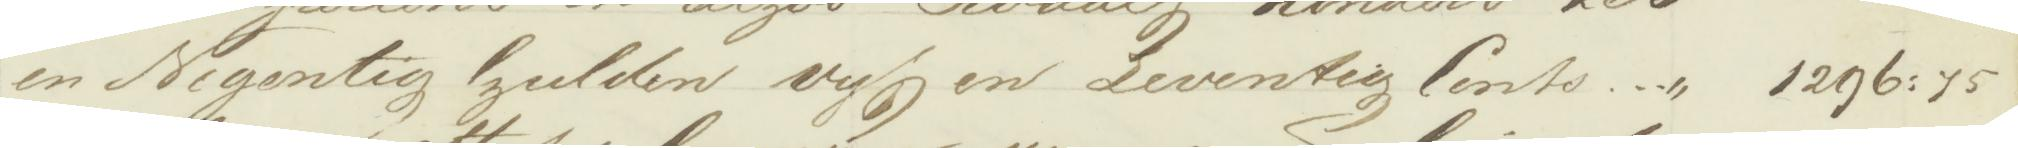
en Negentig Gulden vyf en zeventig Cents . . . „ 1296:75
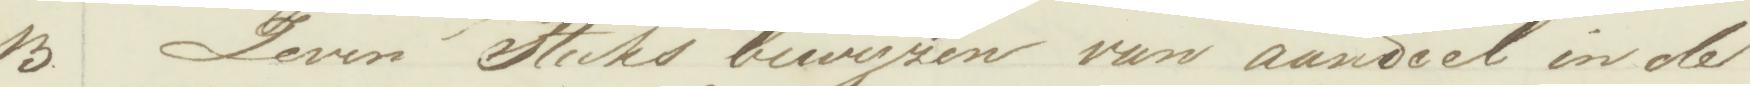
13. Zeven stuks bewyzen van aandeel in de
